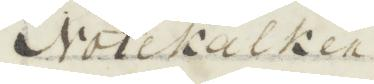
Notekalker
